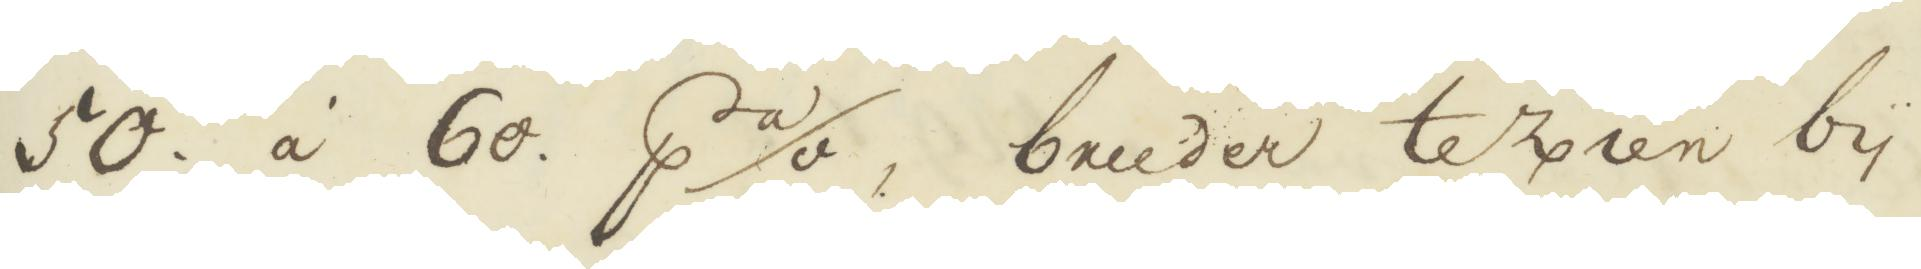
50. a' 60. pa/o, breeder tezien bij
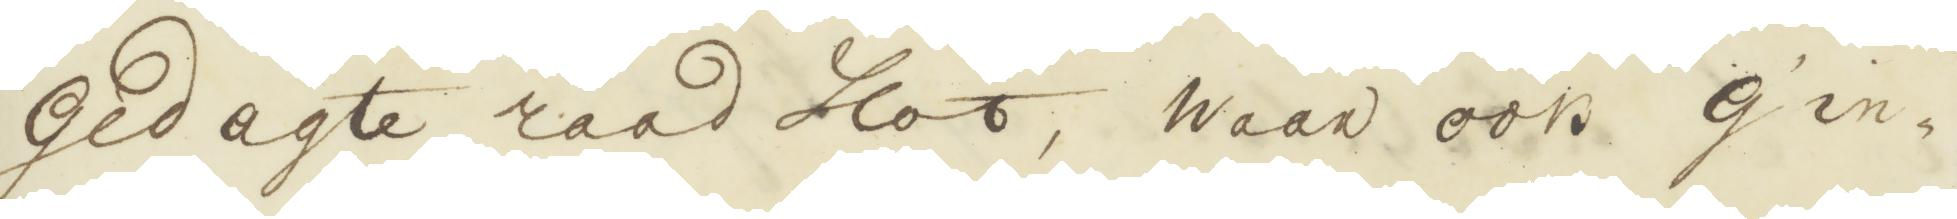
Gedagte raad slot, waar ook g’in„
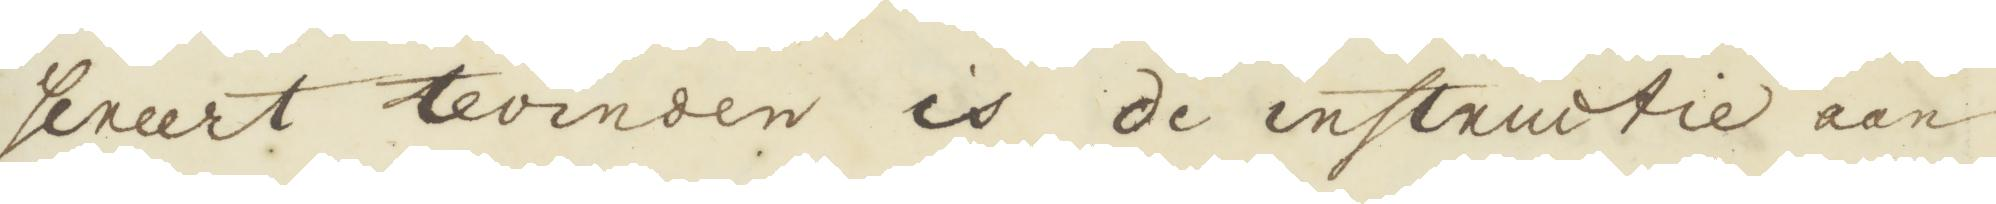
sereert tevinden is de instructie aan
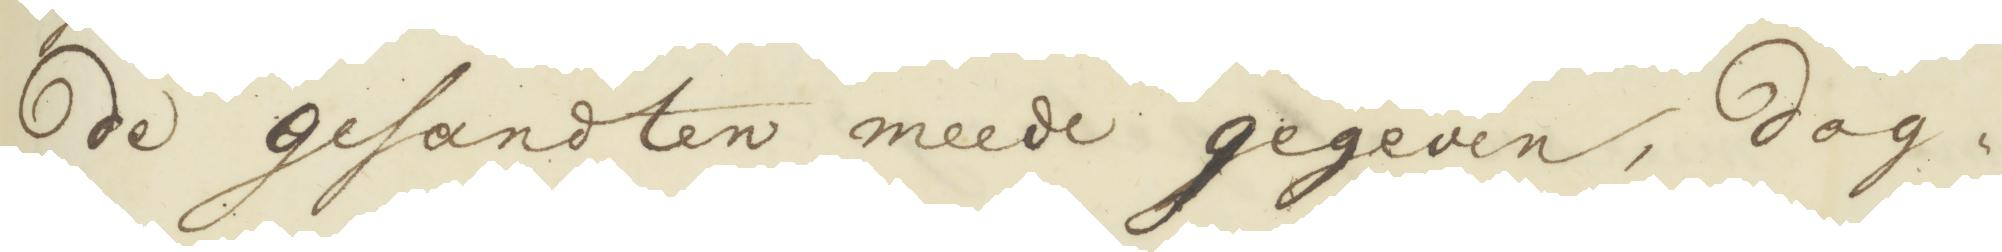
de gesandten meede gegeven, dog„
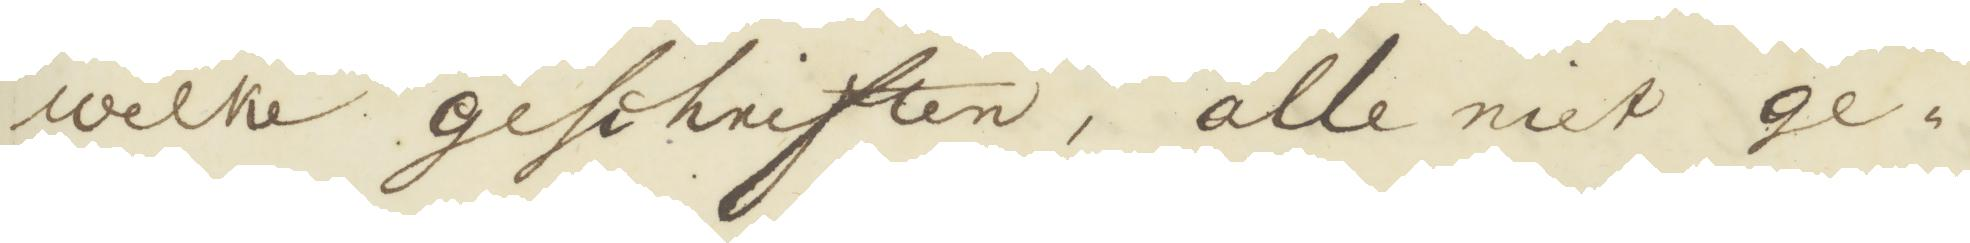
welke geschriften, alle niet ge„
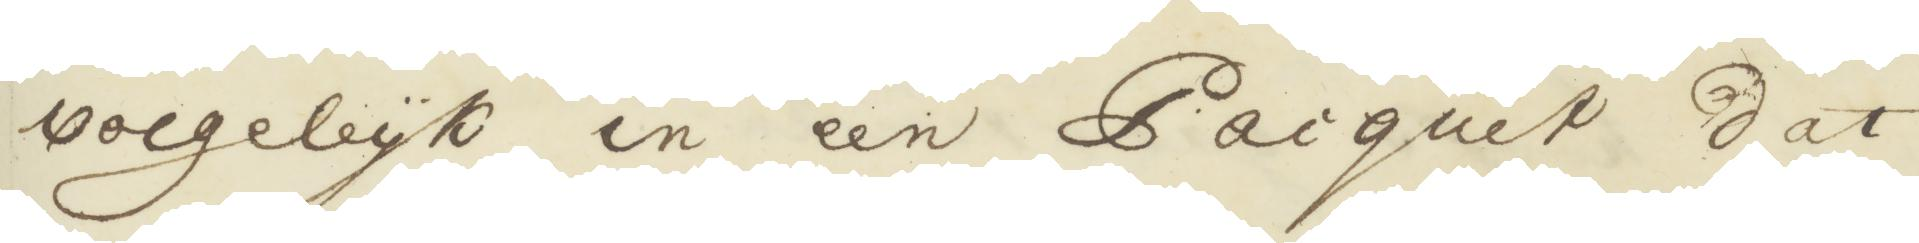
voegeleijk in een Pacquet dat
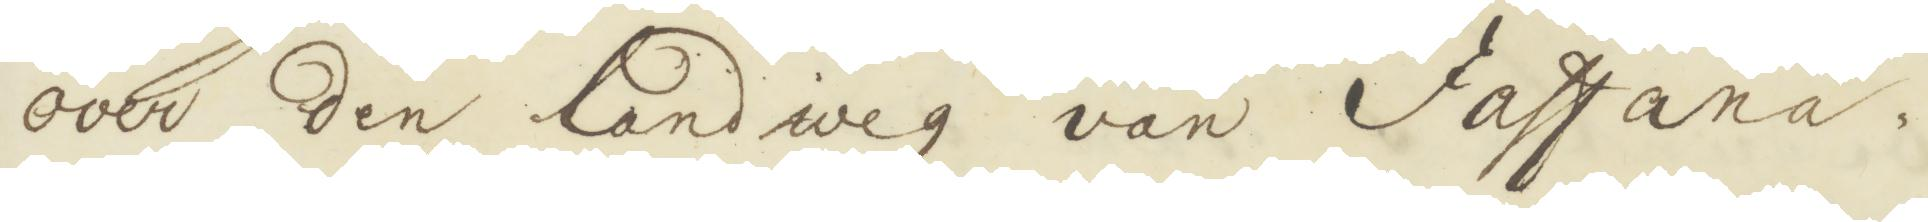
over den landweg van Jaffana„
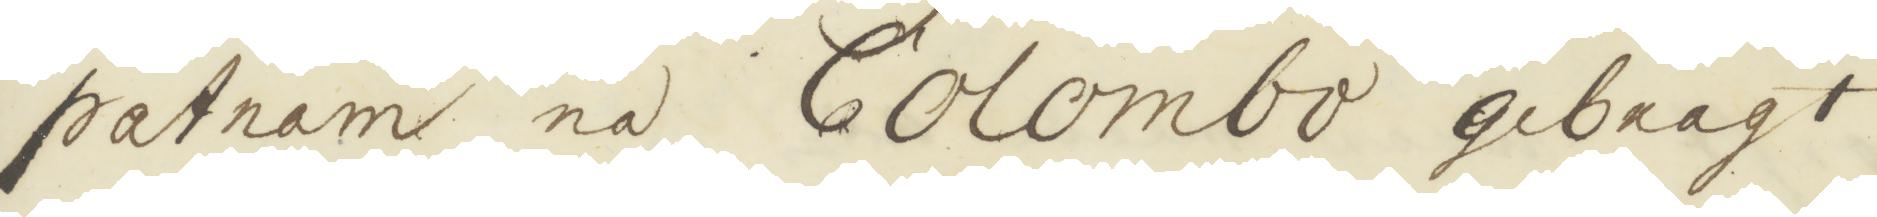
patnam na Colombo gebragt
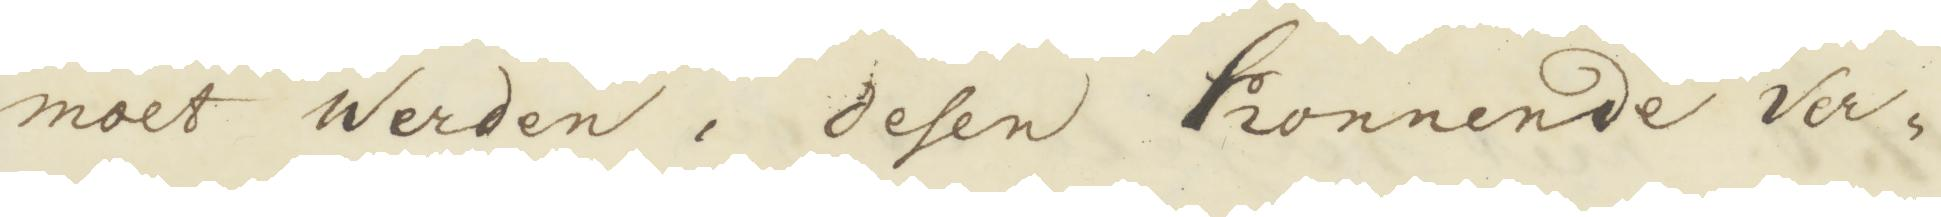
moet werden, desen konnende ver„
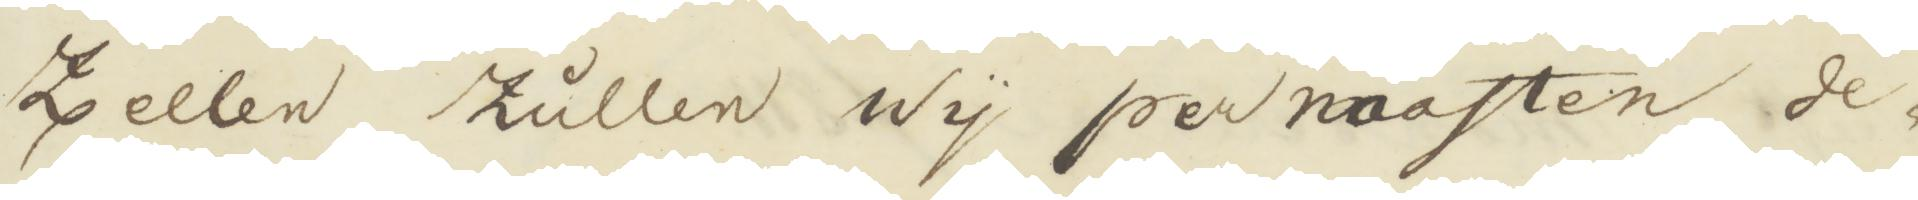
zellen zullen wij per naasten de„
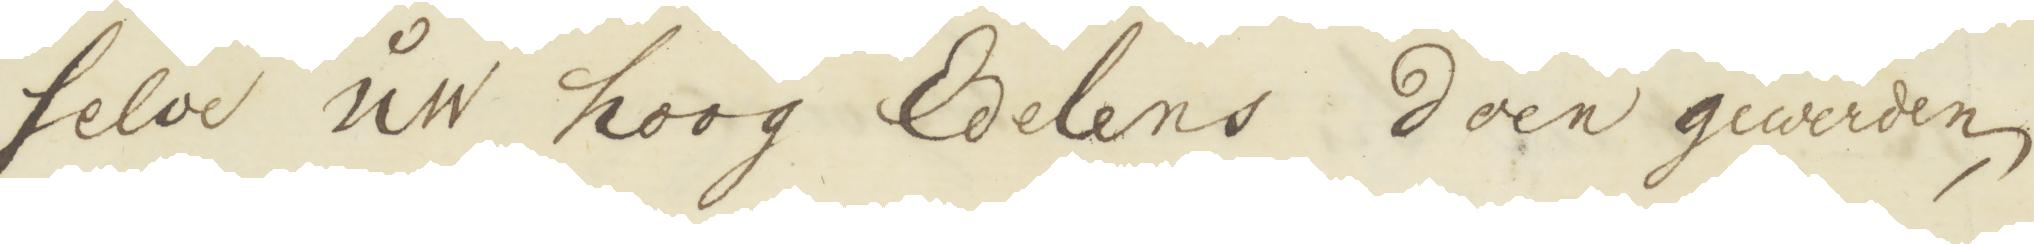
selve uw hoog Edelens doen gewerden,
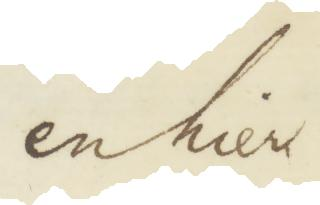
en hier
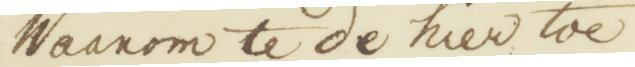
Waarom te de hier toe
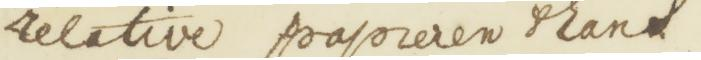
relative papieren thans
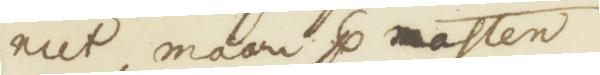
niet, maar p aften
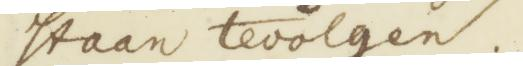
staan tevolgen.
